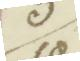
5/18
